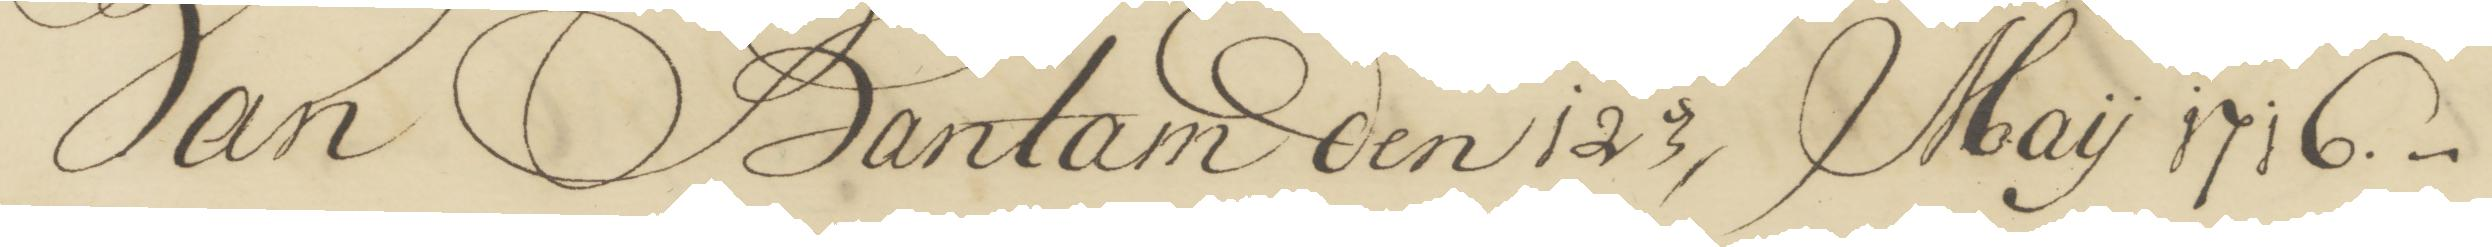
Van Bantam den 12„en Maij 1716. –
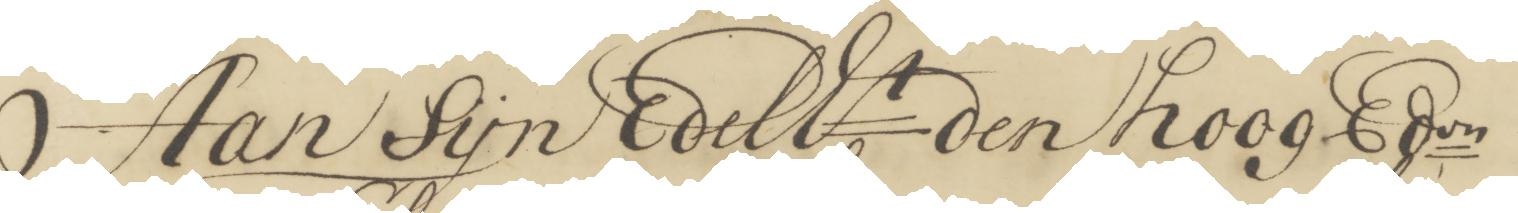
Aan Sijn Edelh=t den hoog Ed=en
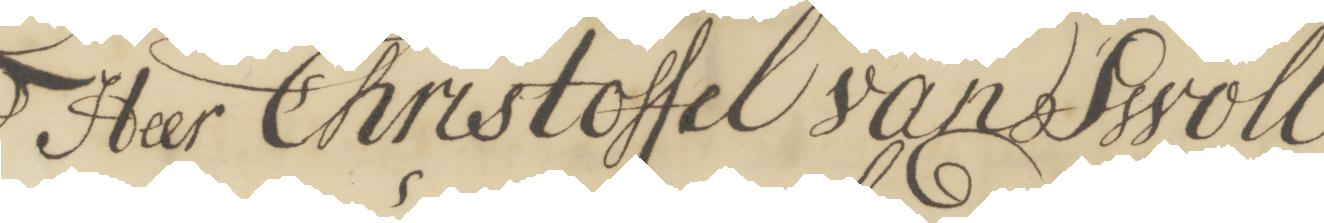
Heer Christoffel van Swoll
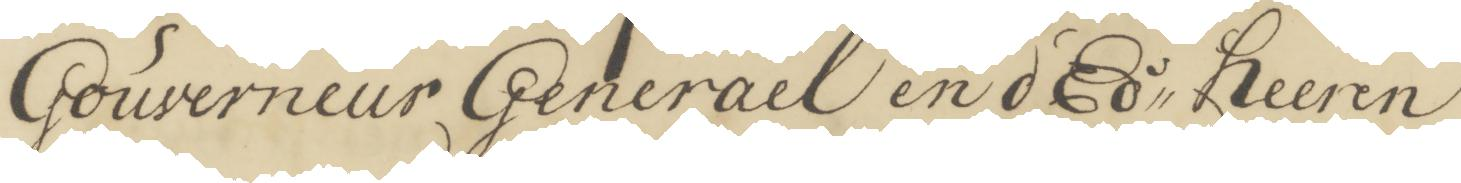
Gouverneur Generael en d’ Ed„e heeren
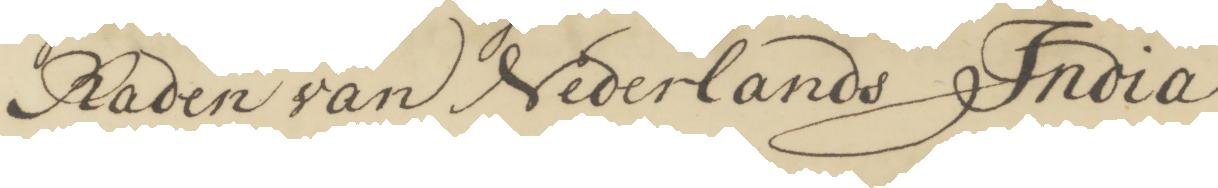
Raden van Nederlands India
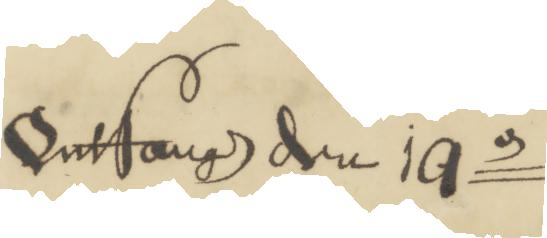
Ontfangen den 14=en
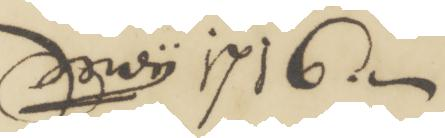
meij 1716.
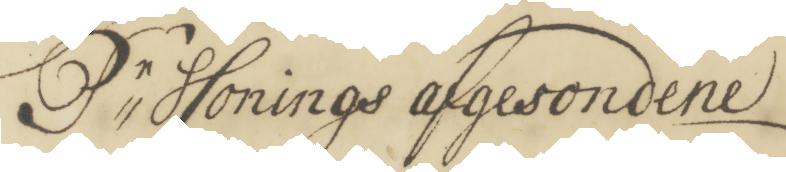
P„r Honings afgesondene
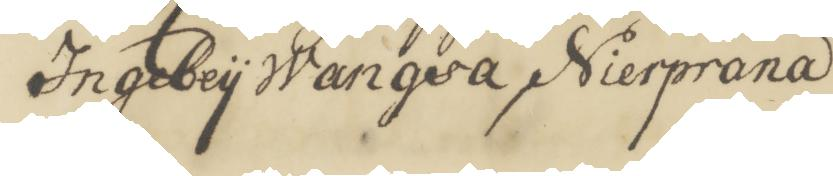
Ingebeij wangsa, Nierprana
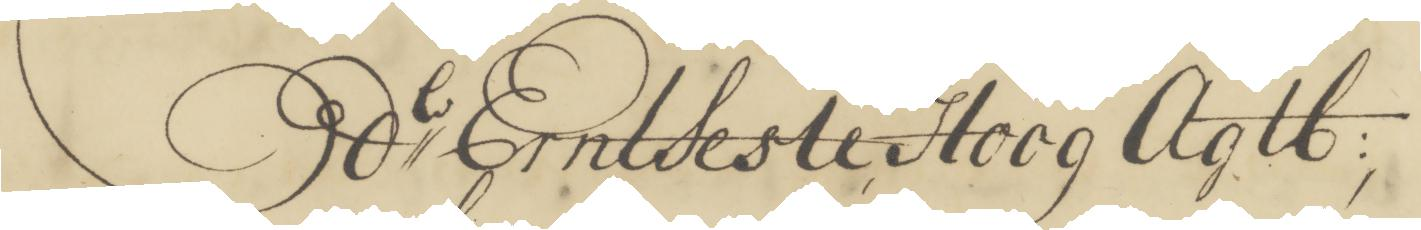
Ed„le Erntfeste Hoog Agtb:,
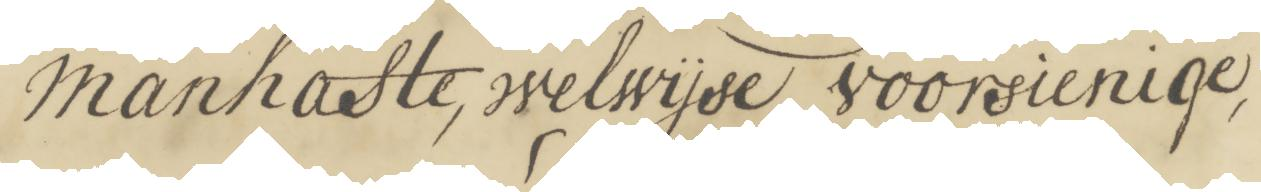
manhaste, welwijse, voorsienige,
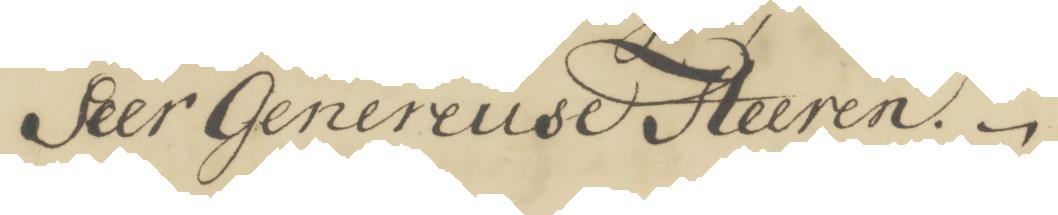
seer Genereuse Heeren.
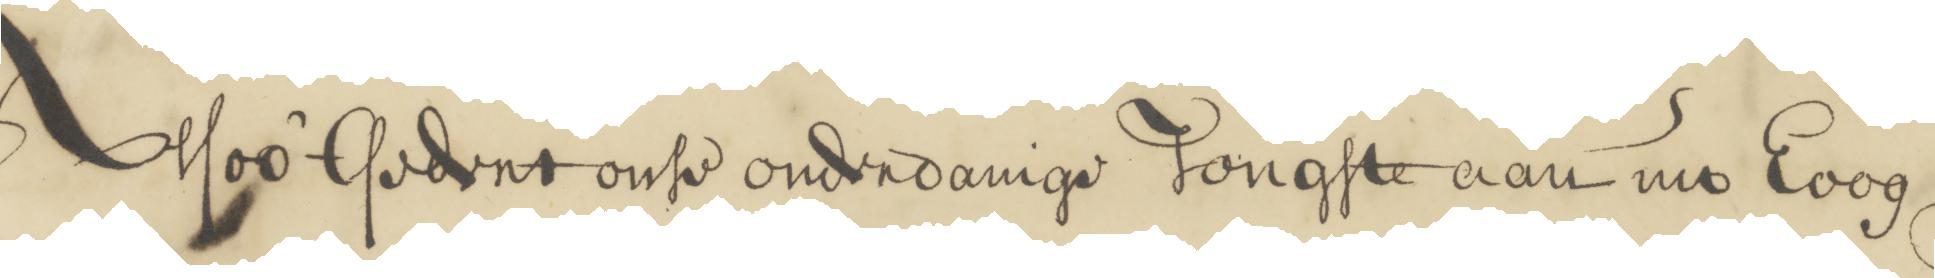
Alsoo tsedert onse onderdanige Jongste aan uw hoog
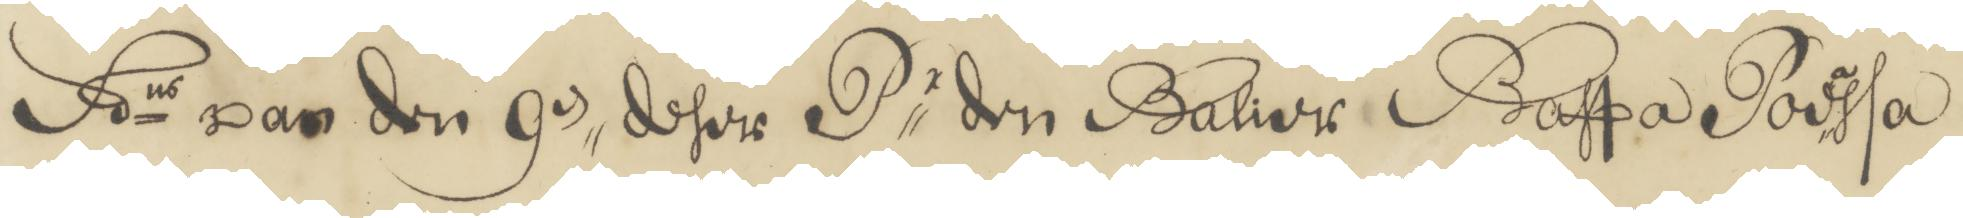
Ed=ns van den 9„en deser P„r den Balier Bappa Poeassa
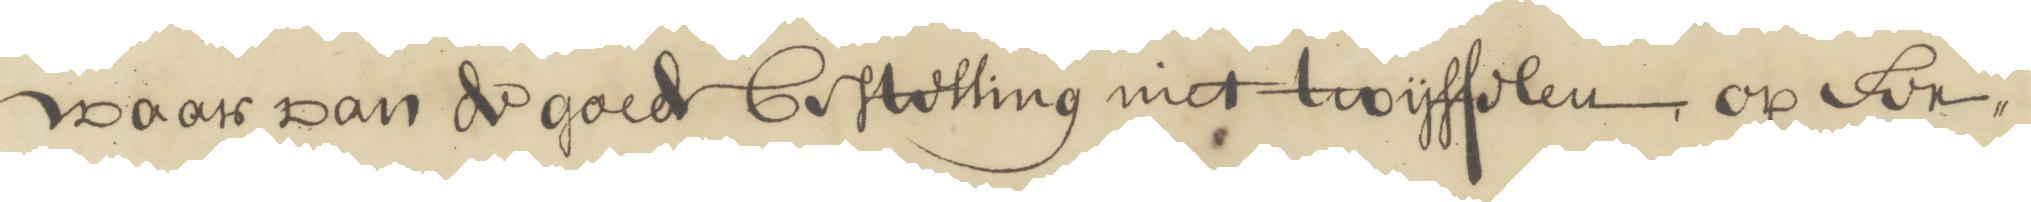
waar van de goede bestelling niet twijffelen, op Eer„
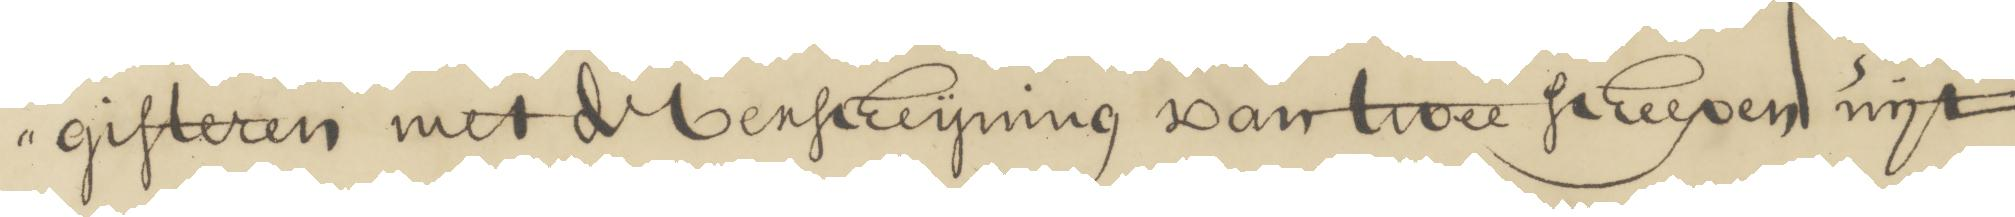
„gisteren met de verscheijning van twee scheepen uijt
